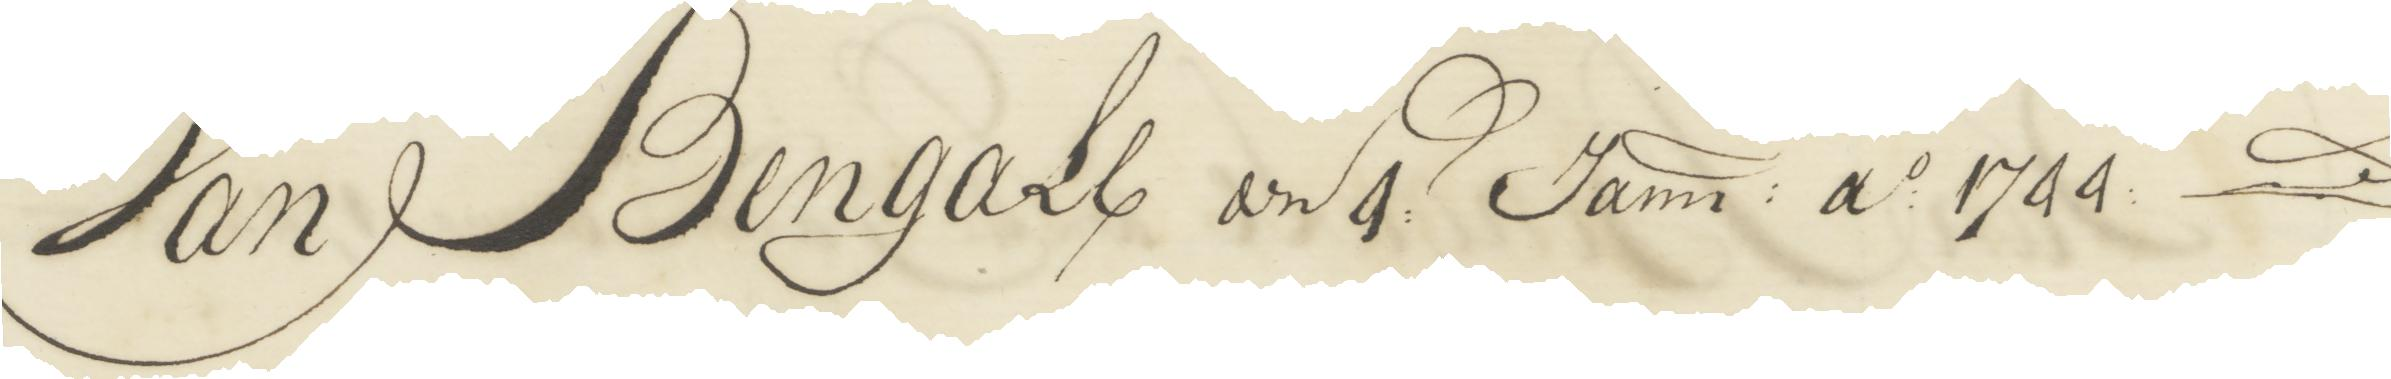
Van Bengale den 4:en Janu: a:o 1744: —
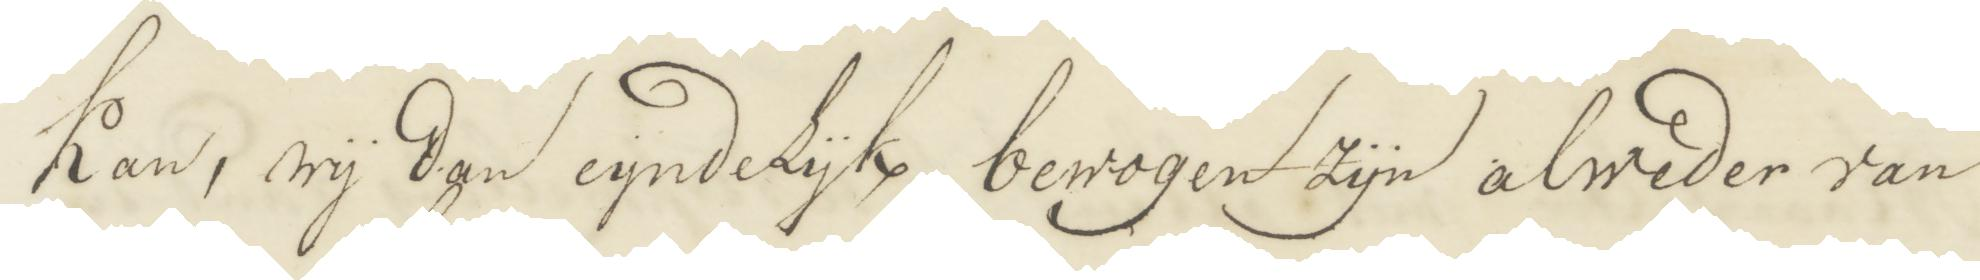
kan, wij dan eijndelijk bewogen zijn alweder van
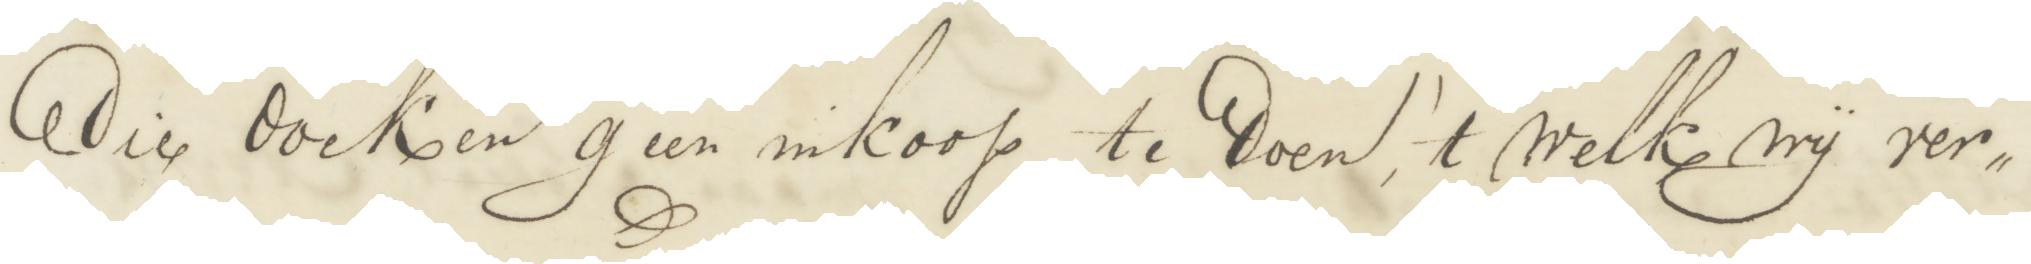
die doeken geen inkoop te doen, ’t welk wij ver„
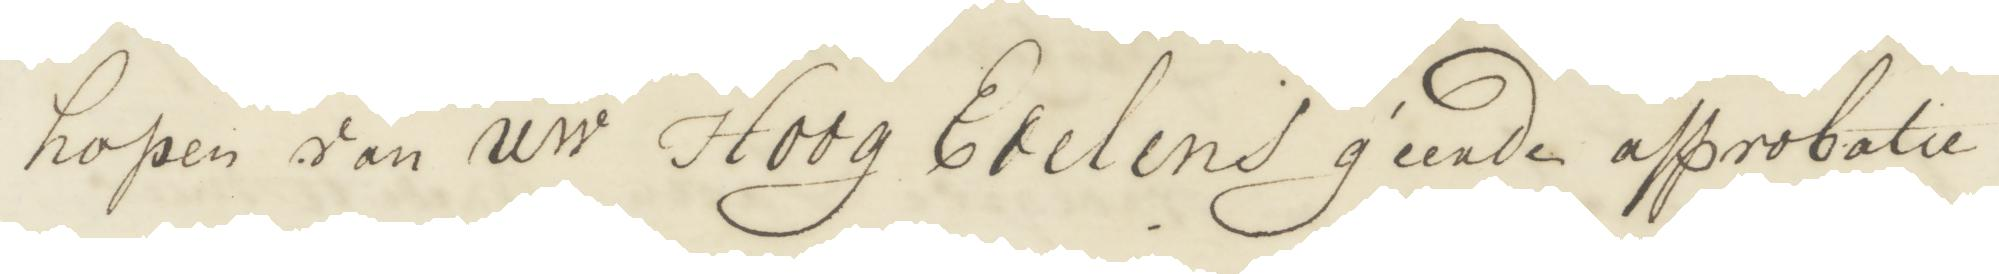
hopen van uw Hoog Edelens g’eerde approbatie
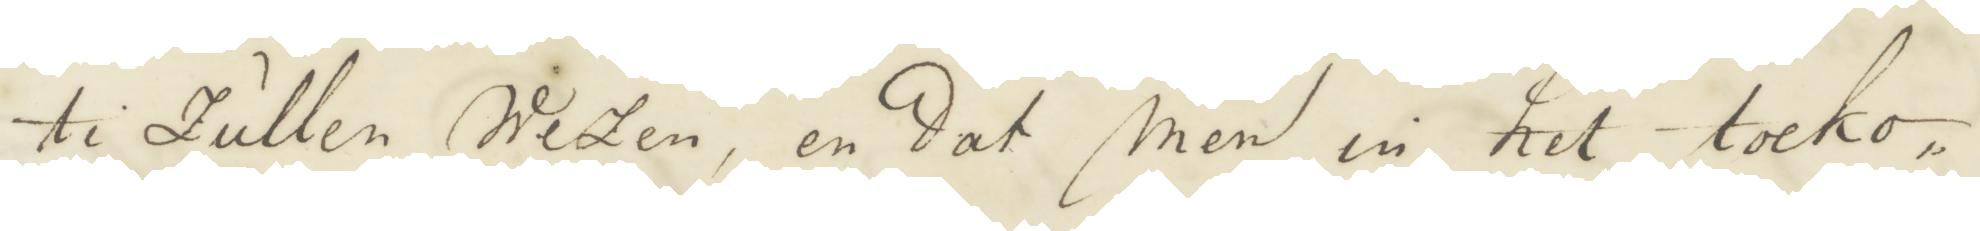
te Zullen Wezen, en dat men in het toeko„
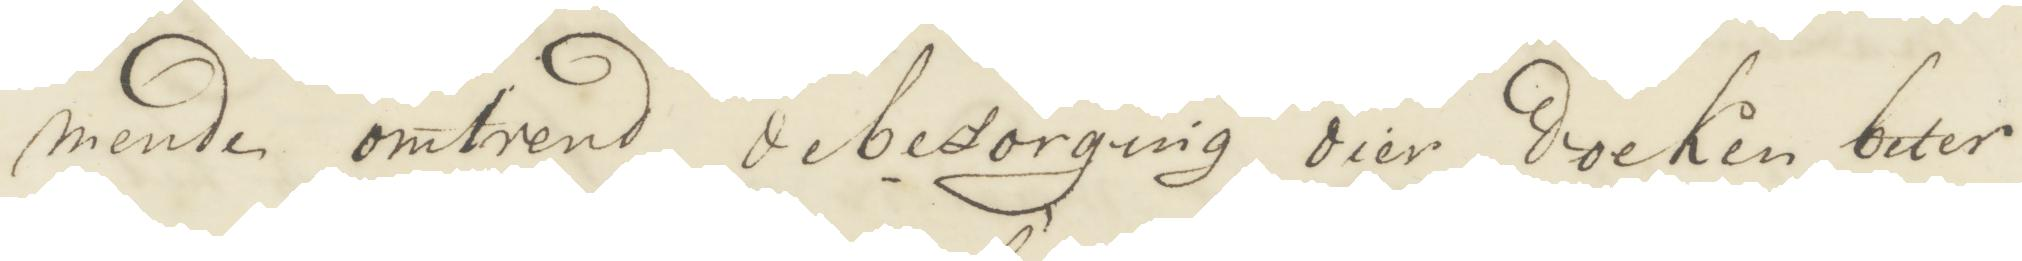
mende omtrend de besorging dier doeken beter
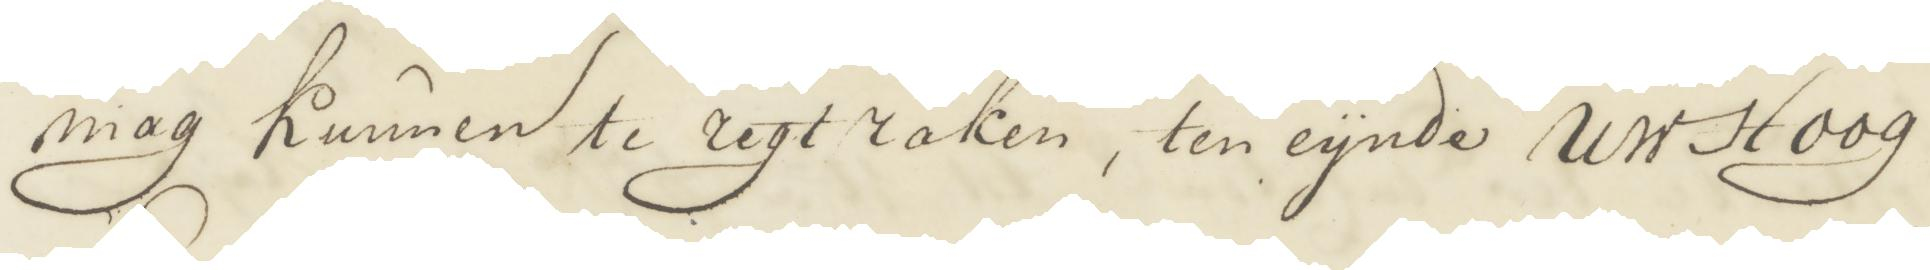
mag kunnen te regt raken, ten eijnde UW Hoog
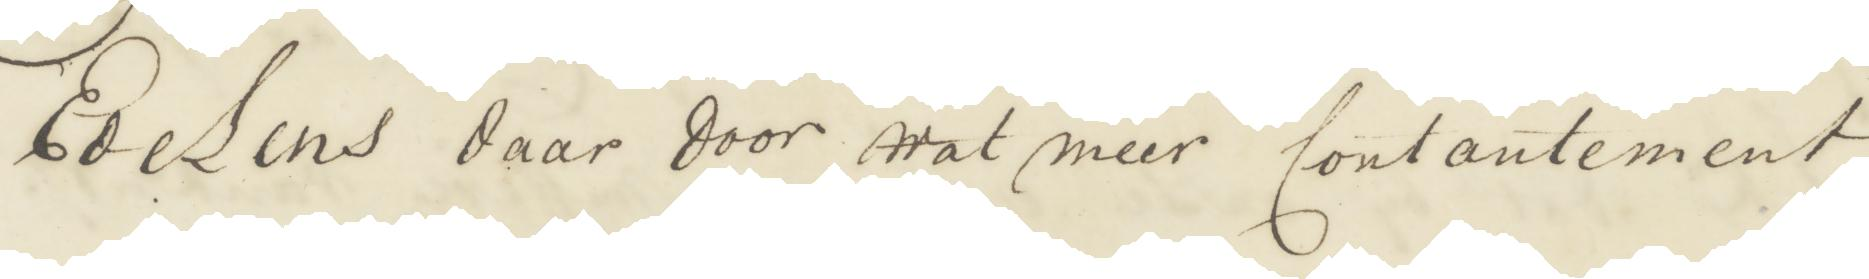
Edelens daar door wat meer Contantement
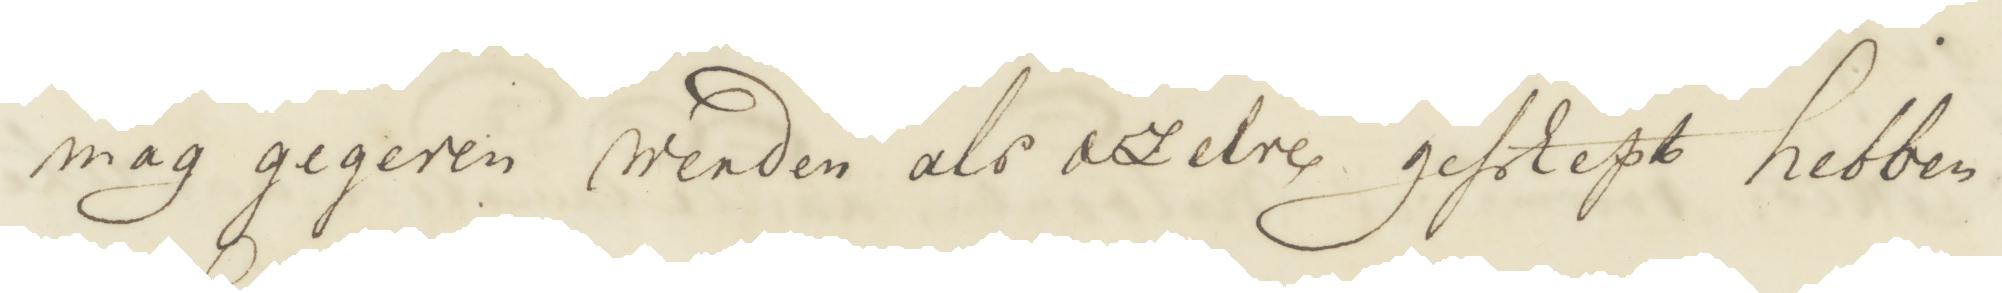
mag gegeven werden als dezelve geschept hebben
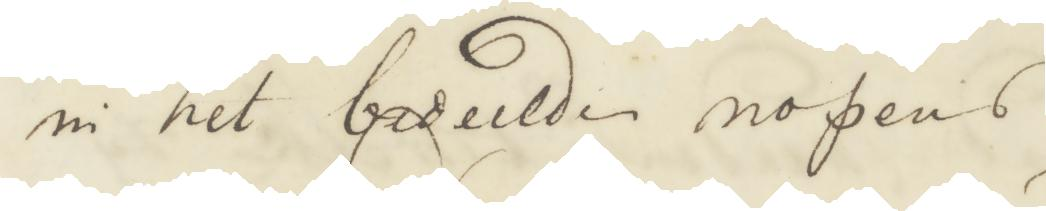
in het bedeelde nopens.
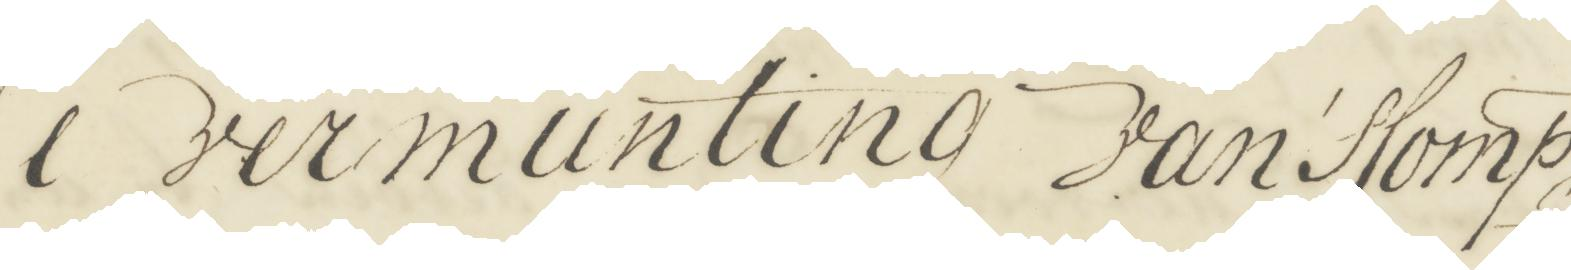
De vermunting van 'sComp:
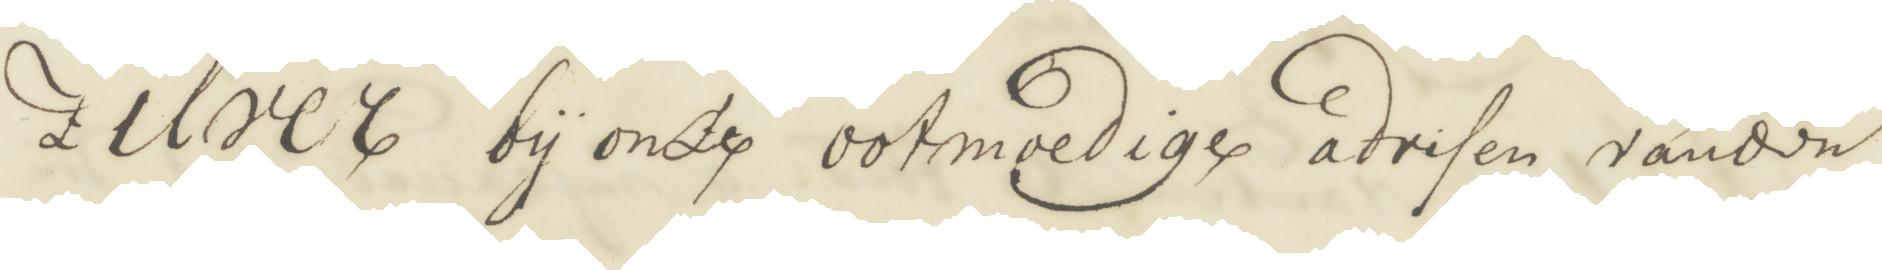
Zilver bij onze ootmoedige advisen van den
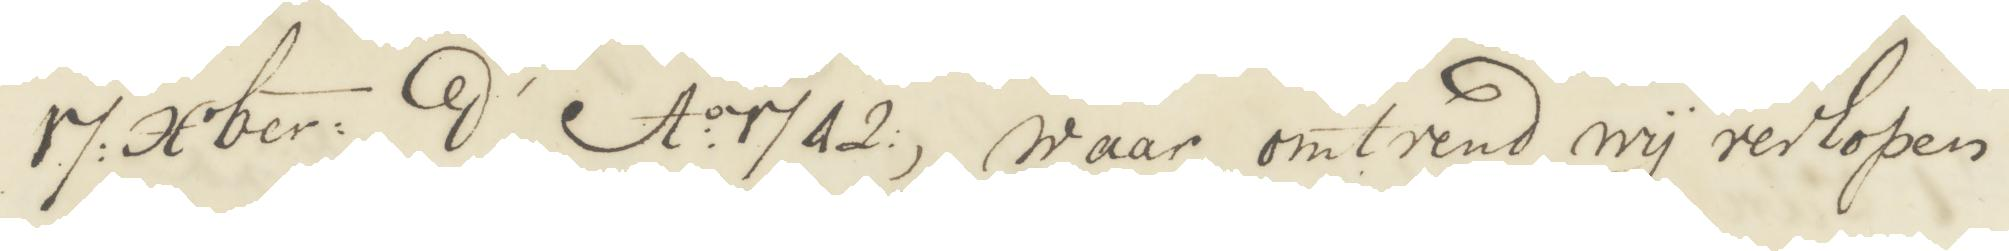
17:' xber: d’ A:o 1742:, waar omtrend wij verhopen
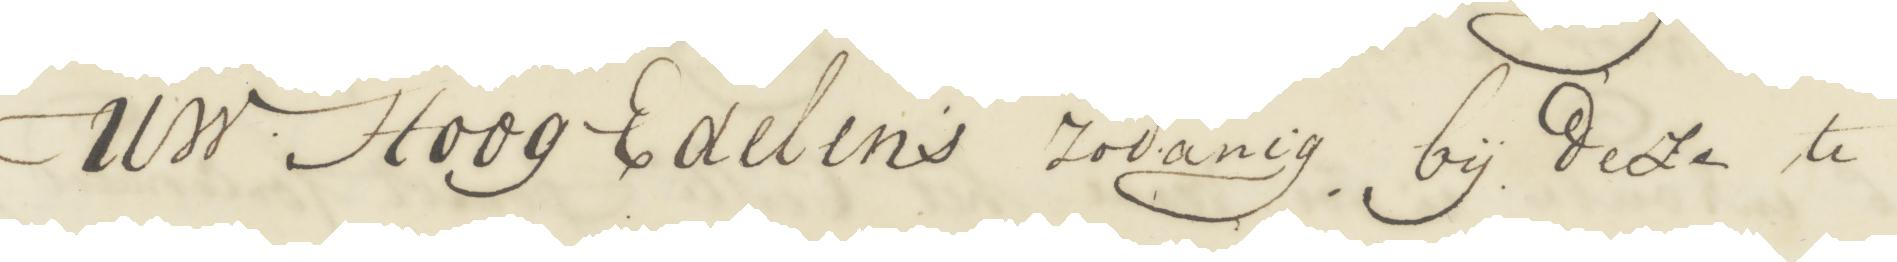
UW Hoog Edelens zodanig bij deze te
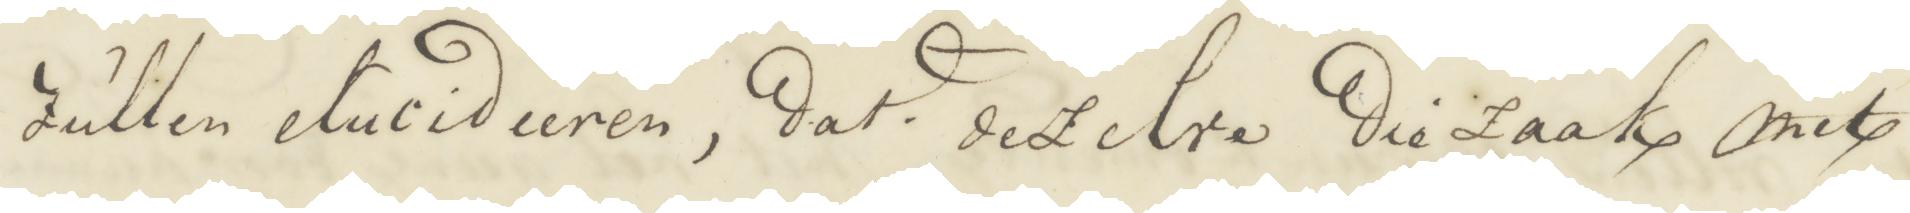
zullen elucideeren, dat dezelve die zaak met
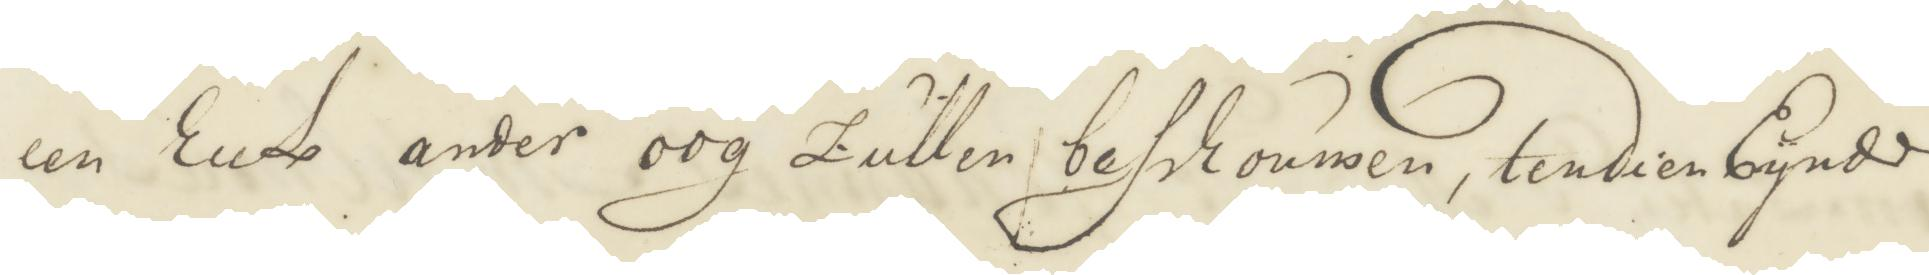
een heel ander oog Zullen beschouwen, ten dien Eijnde
